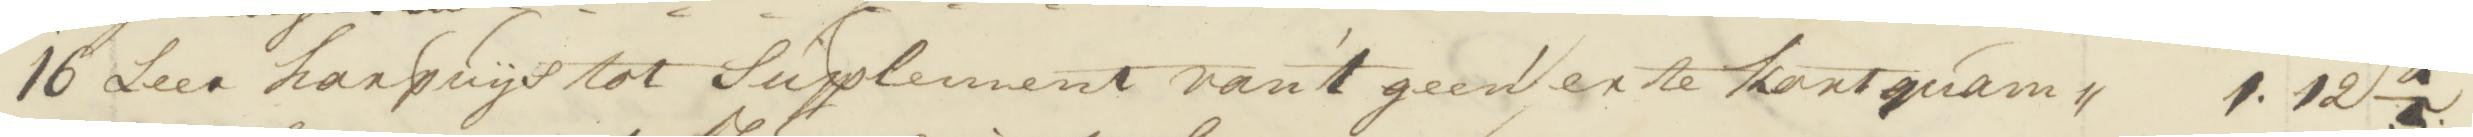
16 Leer harpuijs tot supplement van ’t geen er te kort quam „ 1. 12 4/5
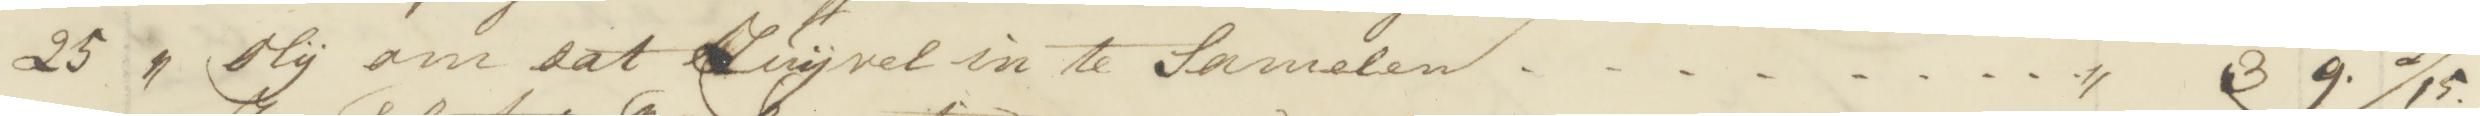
25 „ olij om dat Zuijvel in te Samelen - - - - - - - - - „ 3 9. 2/15.
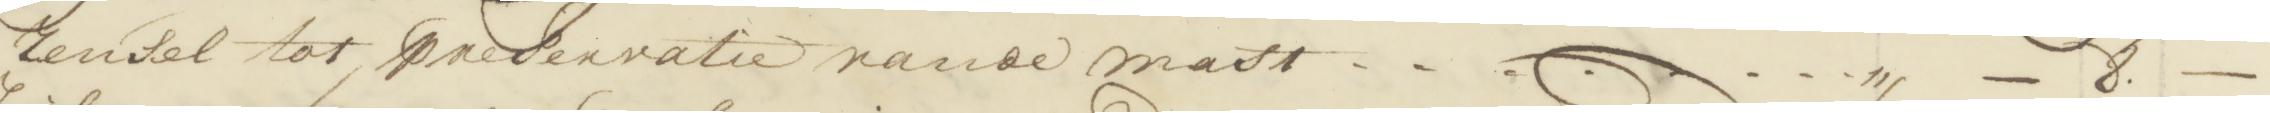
Reusel tot preservatie van de mast - - - - - - - - „ — 8. —
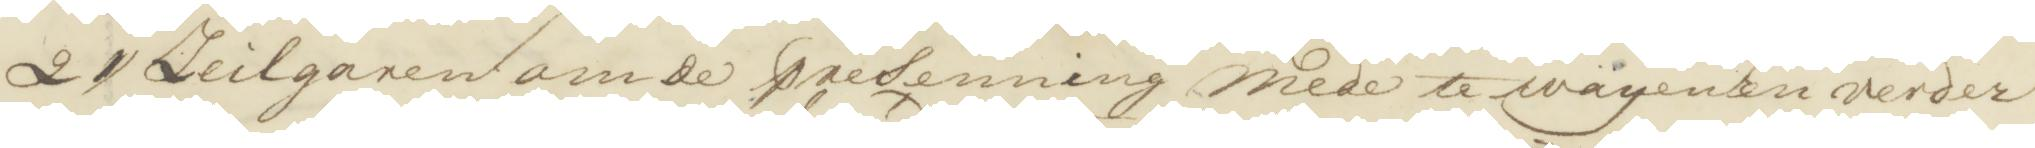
2 „Zeilgaren om de presenning Mede te waijen ten verder
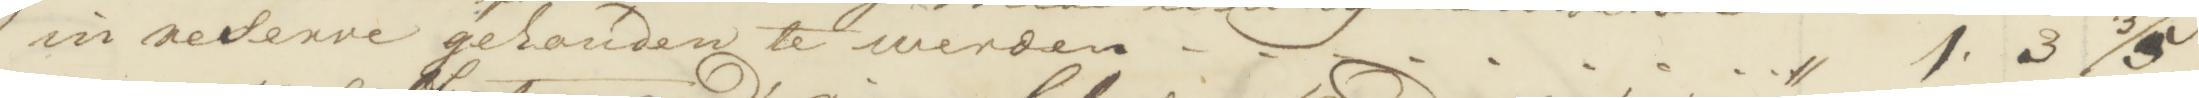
in reserve gehouden te werden - - - - - - - - - „ 1. 3 3/5
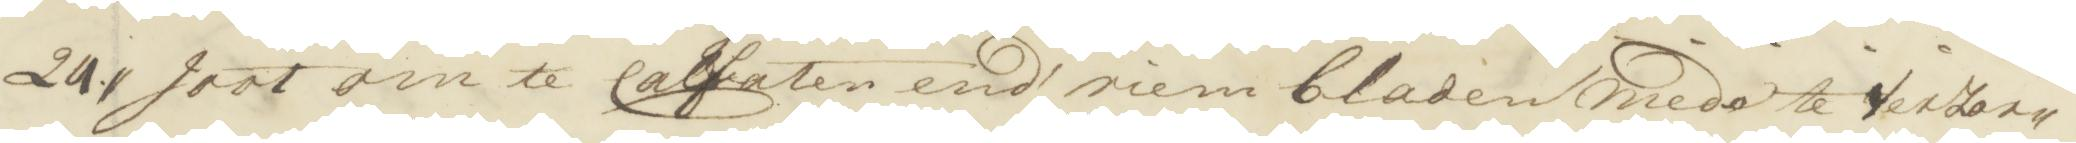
24. „ Joot om te Calfaten en d' riem bladen Mede te verzor„
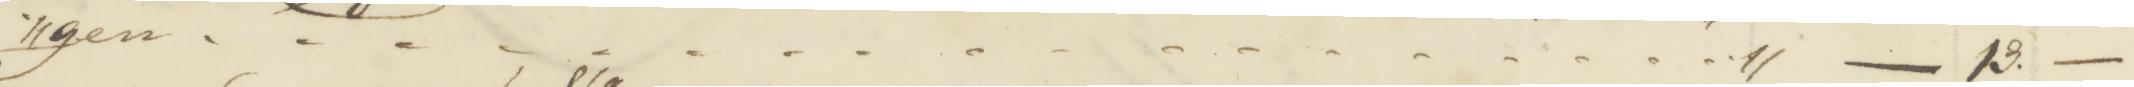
„gen „ - - - - - - - - - - - - - - - - - - - - „— 13. —
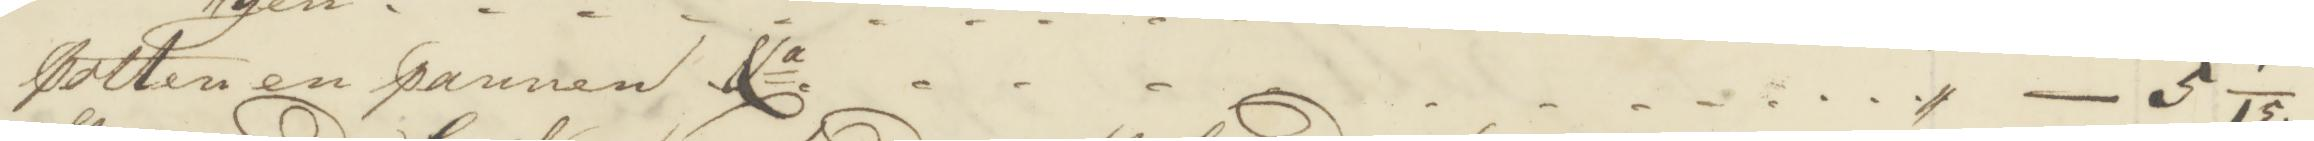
potten en pannen &=a - - - - - - - - - - - - - - - „ — 5 1/15.
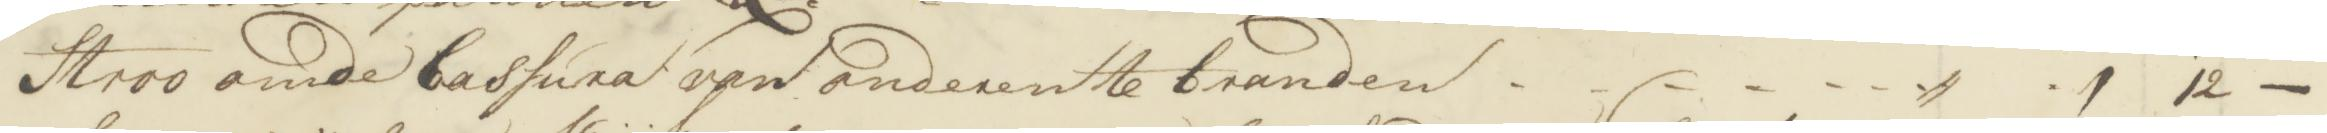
stroo omde bassura van onderen te branden - - - - - - - „ 1 12 —
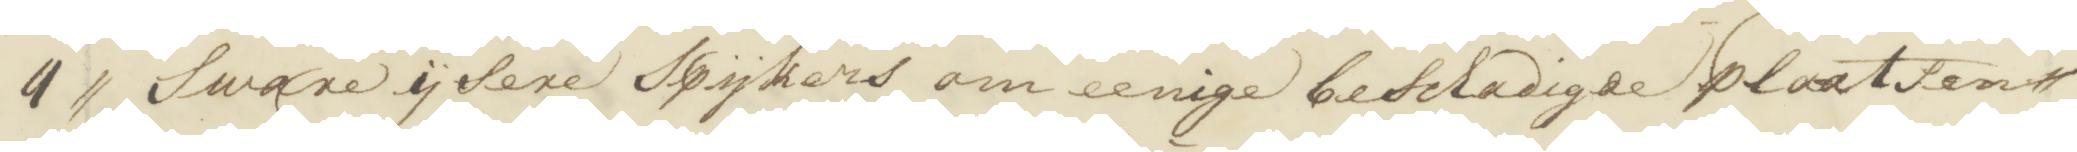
4 „ sware ijsere spijkers om eenige beschadigde plaatsen
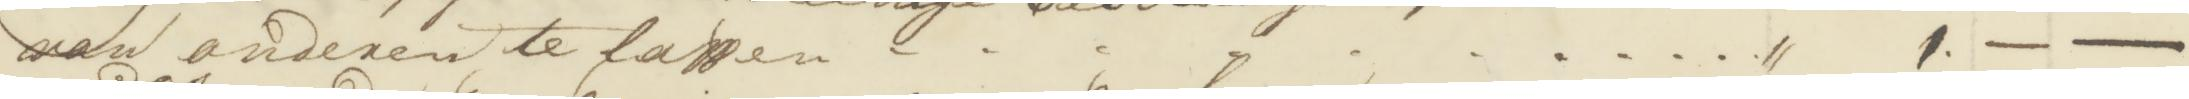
van onderen te lappen - - - - - - - - - - - „ 1. — —
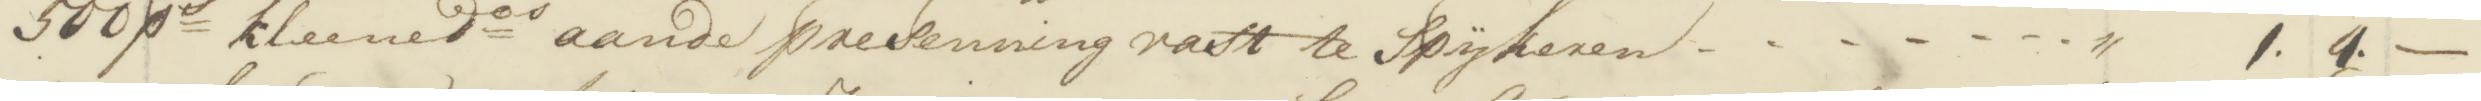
500 p=s kleene d=os aan de presenning vast te spijkeren - - - - - - - „ 1. 4. —
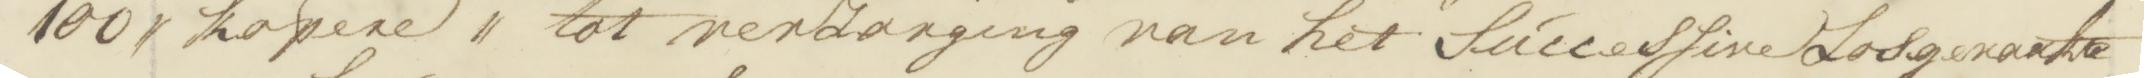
100 „ kopere „ tot verzorging van het Successive Losgeraakte
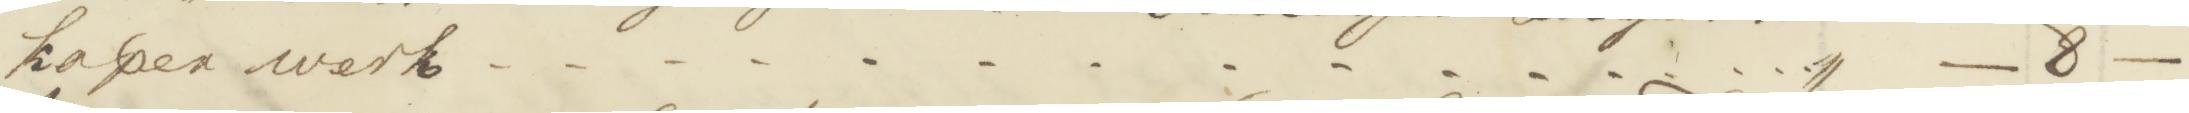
koper werk - - - - - - - - - - - - - - - - - - - „ — 8 —
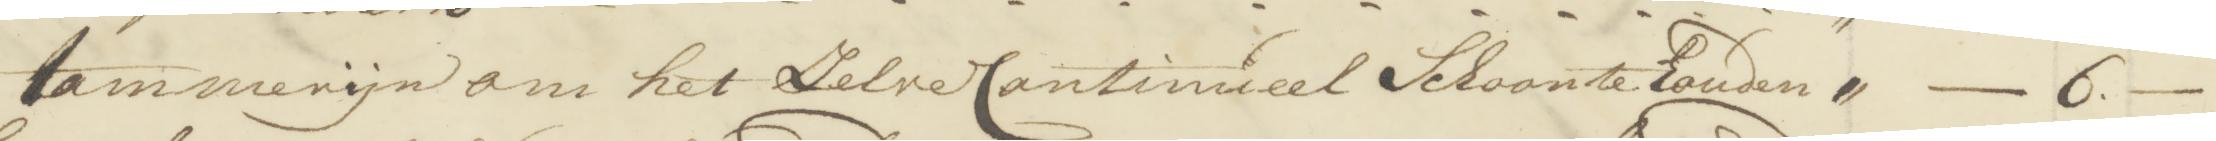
tammerijn om het Zelve Continueel Schoon te houden „ — 6. —
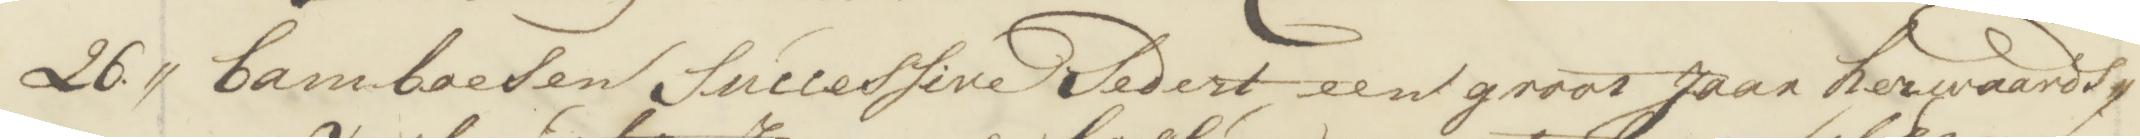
26. „ bamboesen Successive sedert een groot Jaar herwaards
